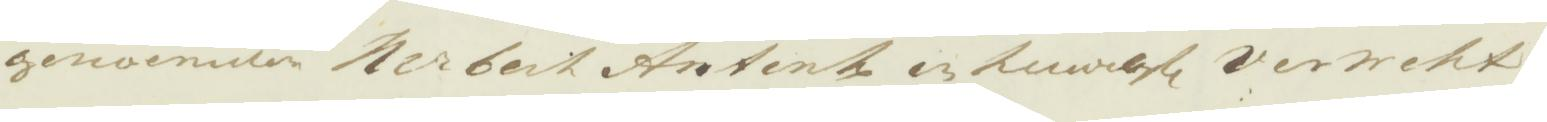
genoemden Herbert Antink in huwelyk verwekt,
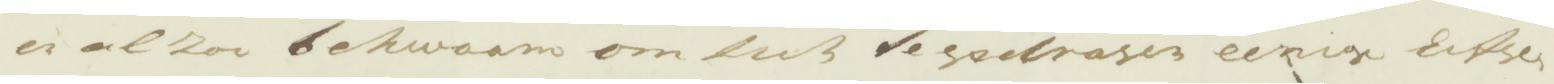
en al zoo bekwaam om zich te gedragen eenige Erfge
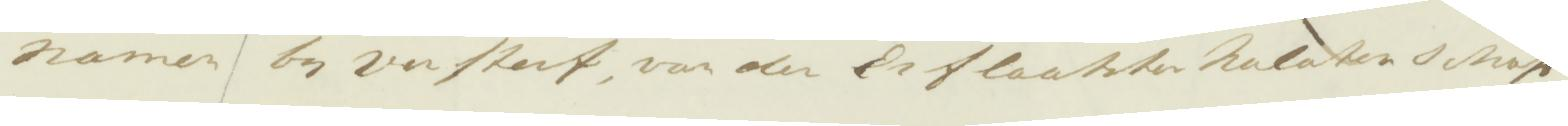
namen / by versterf, van der Erflaatster nalatenschap
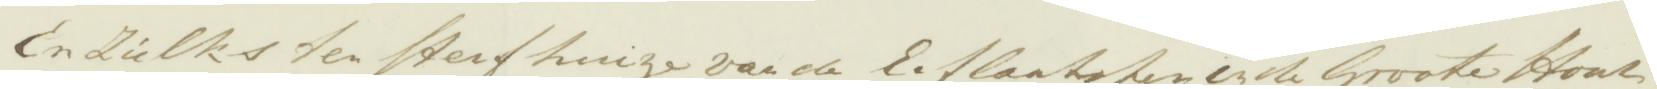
En zulks ten sterfhuize van de Erflaatster in de Groote Hout
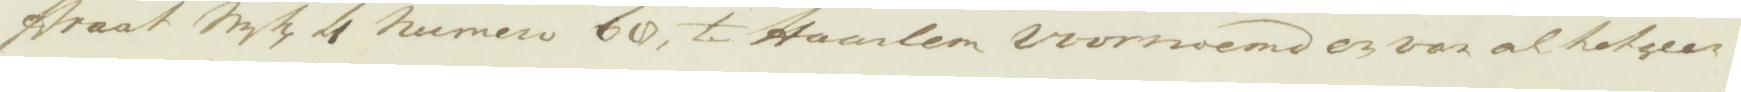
straat wyk 4 numero 68, te Haarlem voornoemd en van al het geen
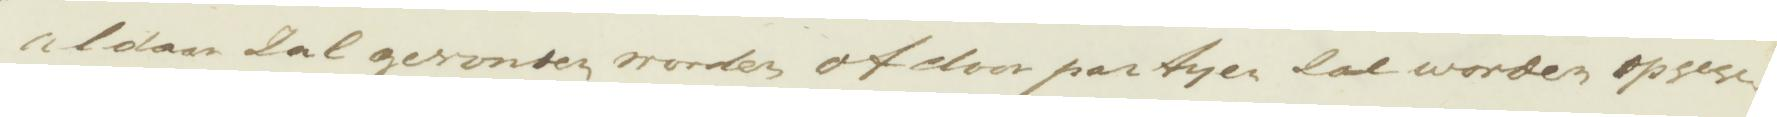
aldaar zal gevonden worden of door partyen zal worden opgege
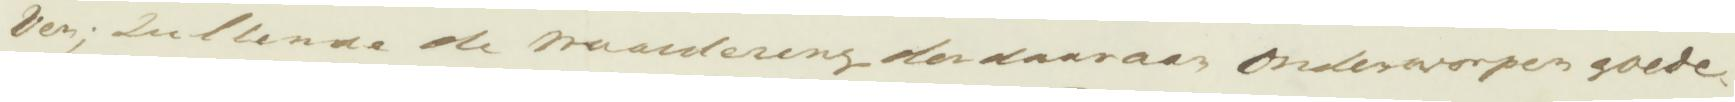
ven; zullende de waardering der daaraan onderworpen goede
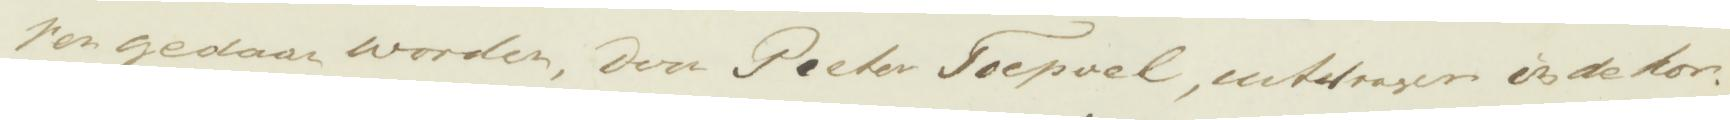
ren gedaan worden, door Pieter Toepoel, uitdrager in de kor
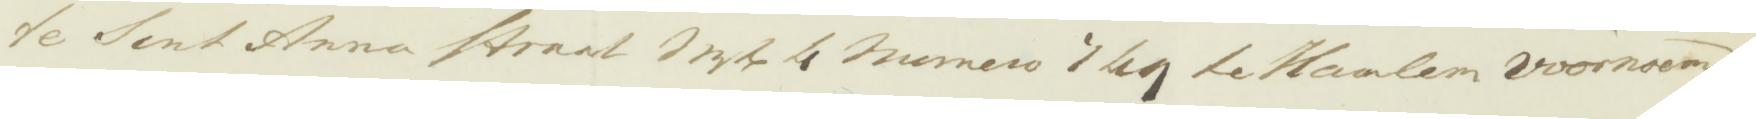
te Sint Anna straat wyk 4 Numero 749 te Haarlem voornoemd
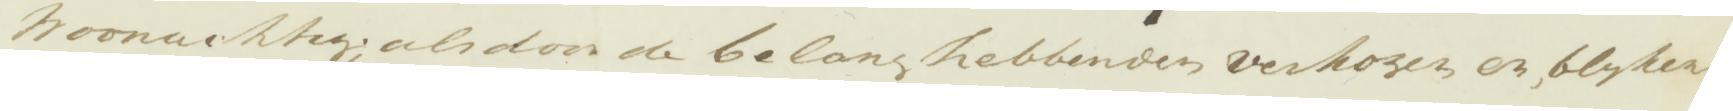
woonachtig, als door de belanghebbenden verkozen en blykens
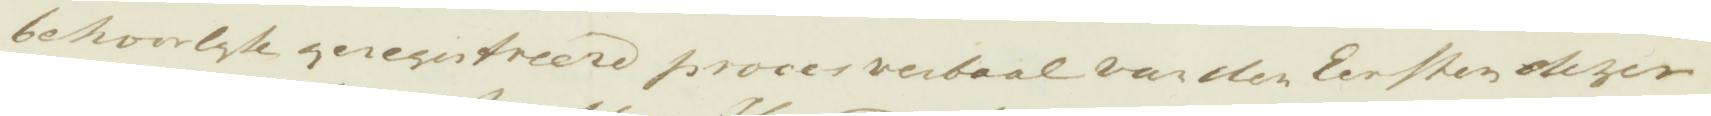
behoorlyk geregistreerd proces verbaal van den Eersten dezer
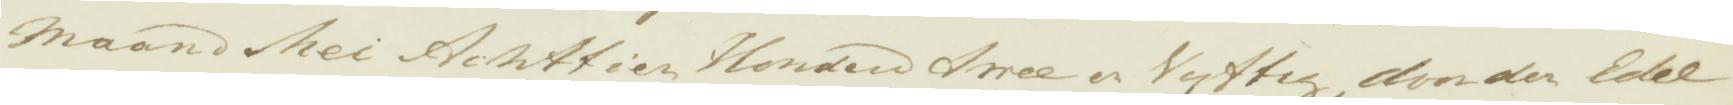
maand Mei Achttien Honderd Twee en Vyftig, door den Edel
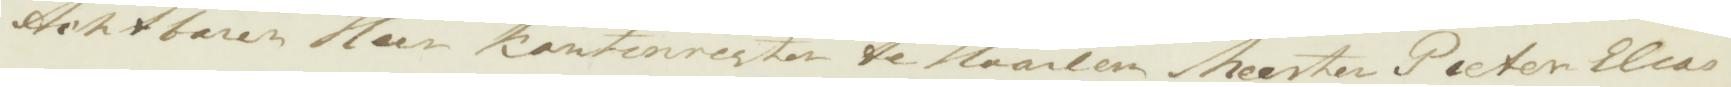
Achtbaren Heer kantonregter te Haarlem Meester Pieter Elias
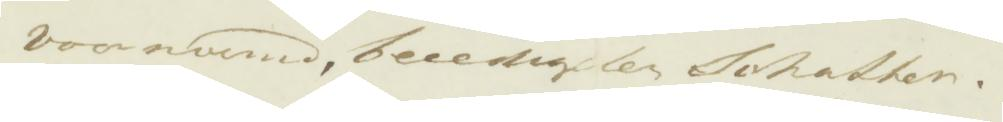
voornoemd, beeedigden schatter.
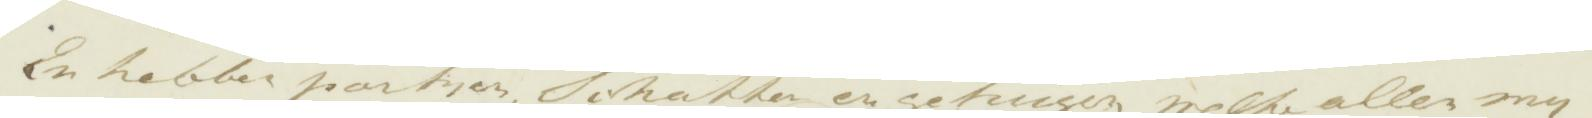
En hebben partyen, schatter en getuigen, welke allen my
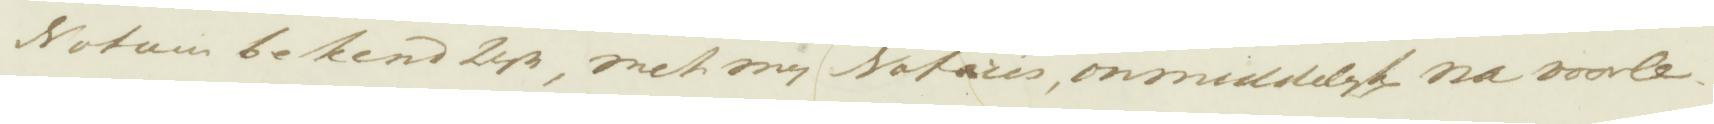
Notaris bekend zyn, met my Notaris, onmiddelyk na voorle.
